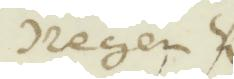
Negen en
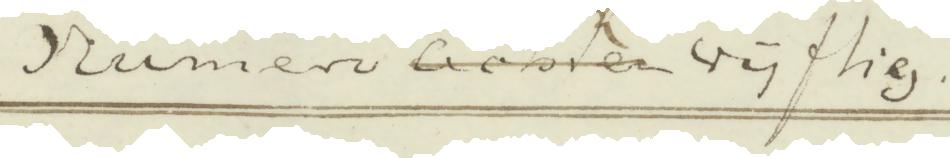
Numero achten vijftig.
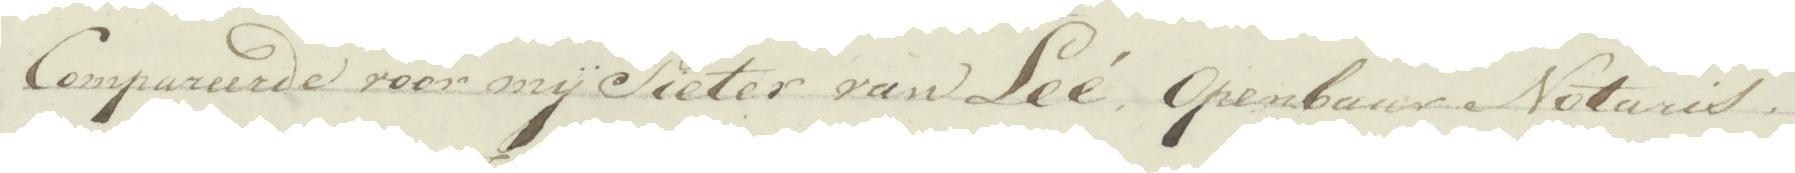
Compareerde voor mij Pieter van Leé, Openbaar Notaris,
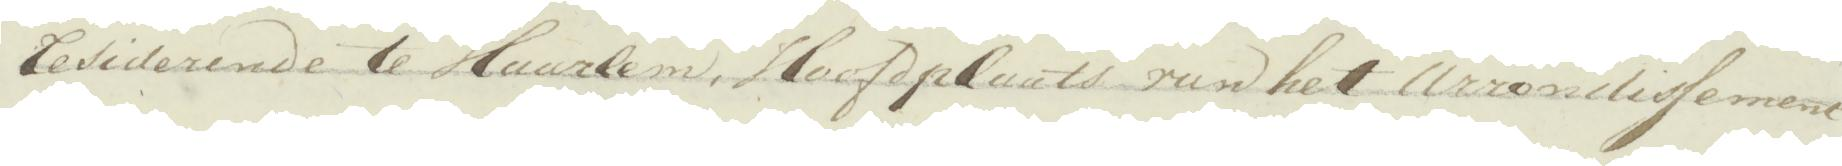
residerende te Haarlem, Hoofdplaats van het Arrondissement
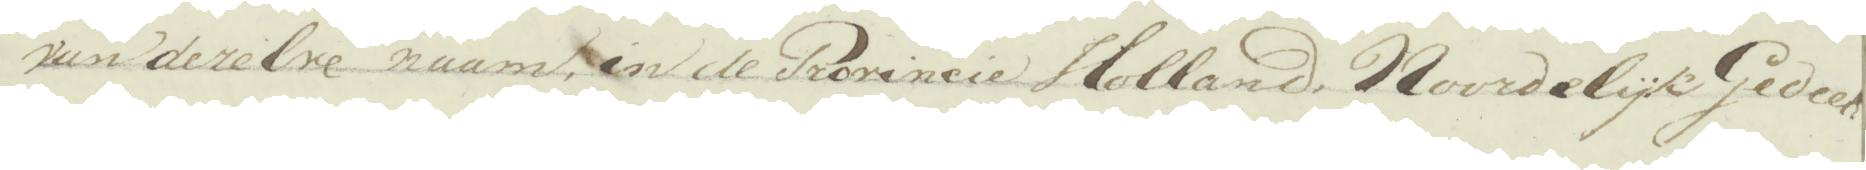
van dezelve naam, in de Provincie Holland, Noordelijk Gedeel.
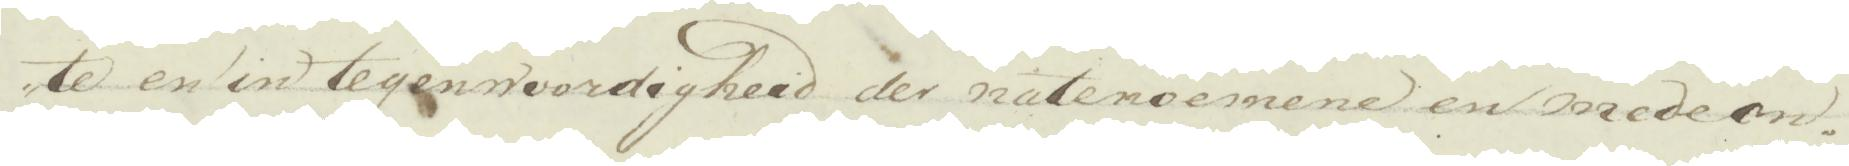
„te en in tegenwoordigheid der natenoemene en mede on„
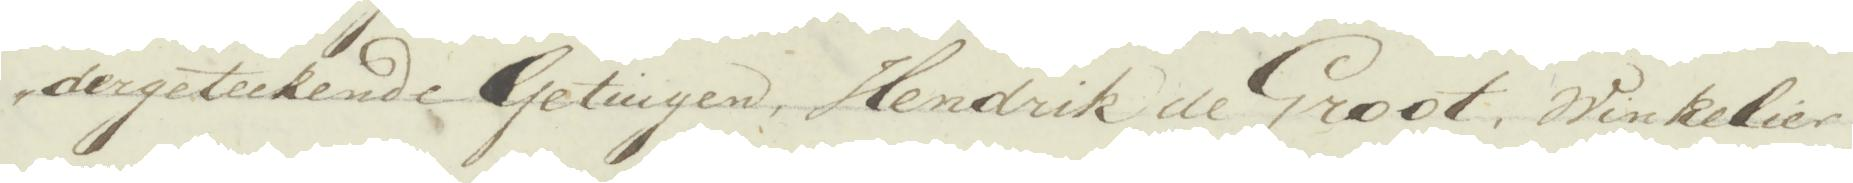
„dergeteekende Getuigen Hendrik de Groot, Winkelier
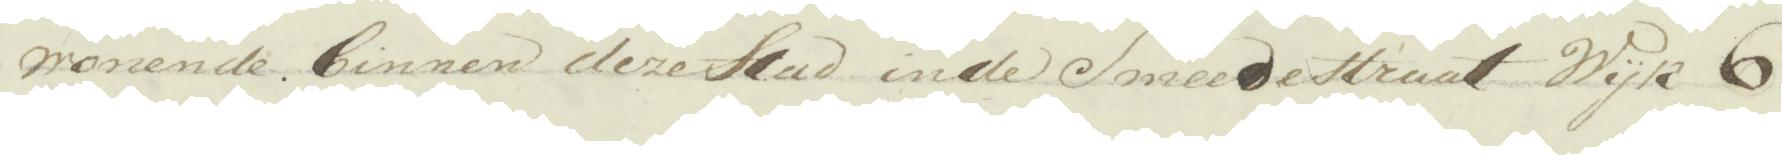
wonende binnen deze stad in de Smeedestraat Wijk 6
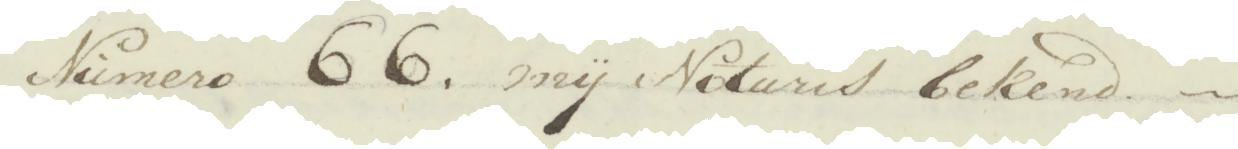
Numero 66. mij Notaris bekend.
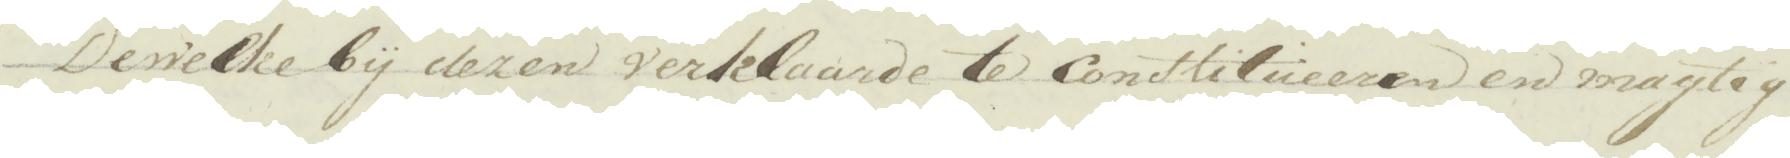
Dewelke bij dezen verklaarde te constitueeren en magtig
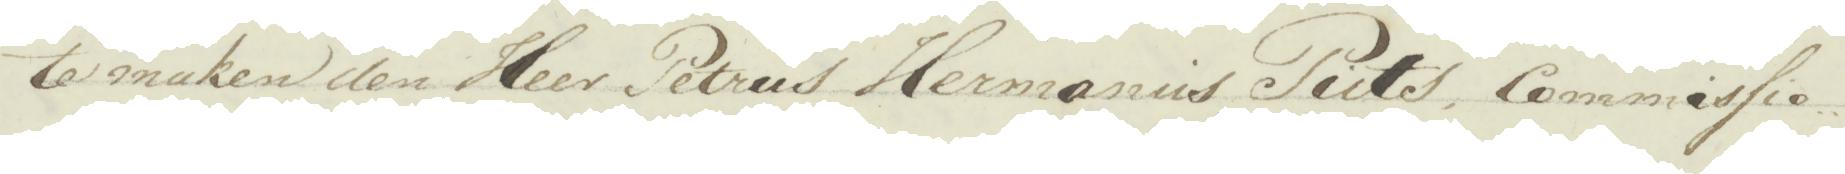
te maken den Heer Petrus Hermanus Puts, Commissio
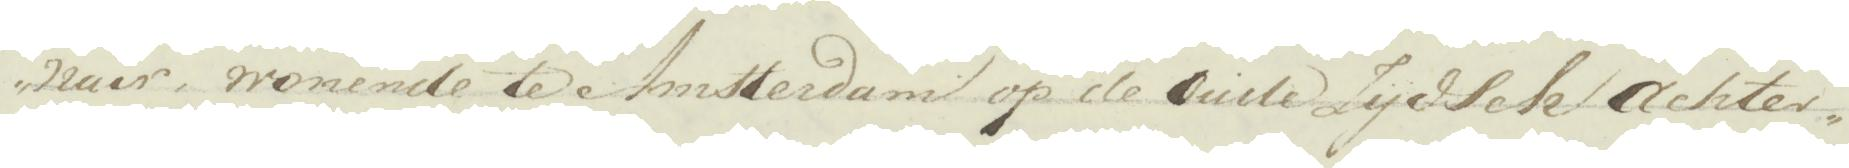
„nair, wonende te Amsterdam op de oude zijdsch achter„
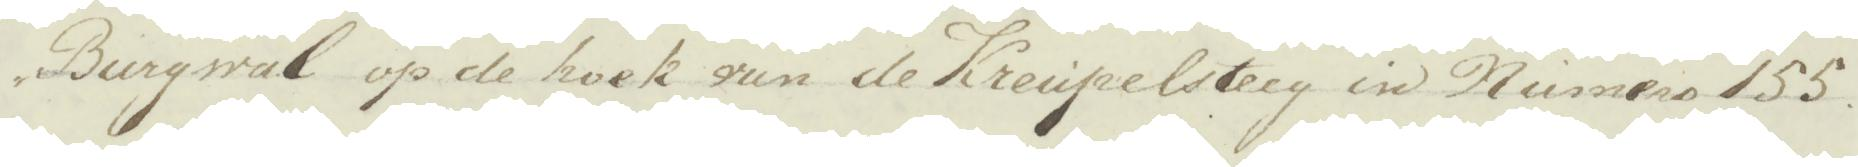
„Burgwal op de hoek van de Kreupelsteeg in Numero 155.
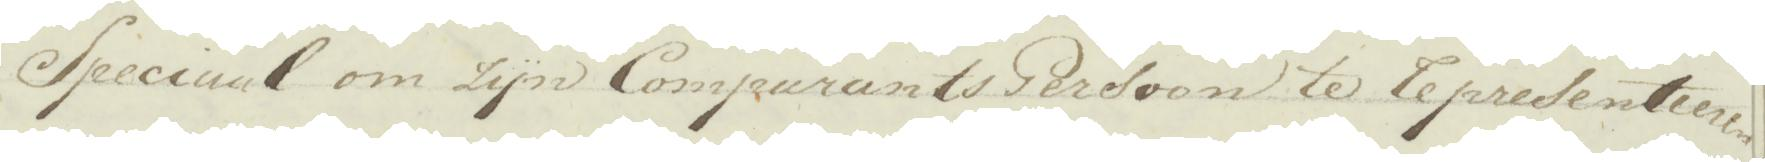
Speciaal om zijn Comparants Persoon te representeren
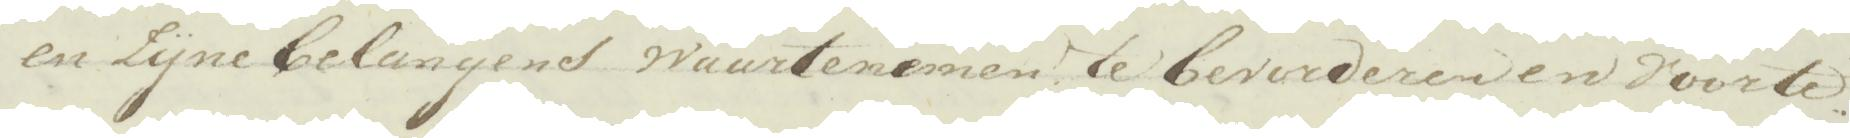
en zijne belangens waartenemen, te bevorderen en voorte
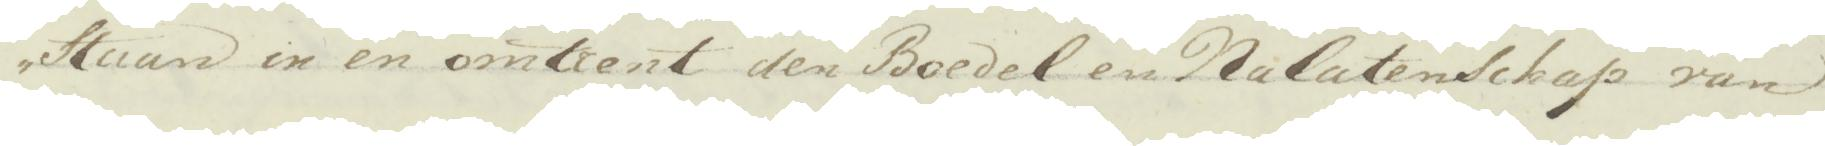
„staan in en omtrent den Boedel en Nalatenschap van
